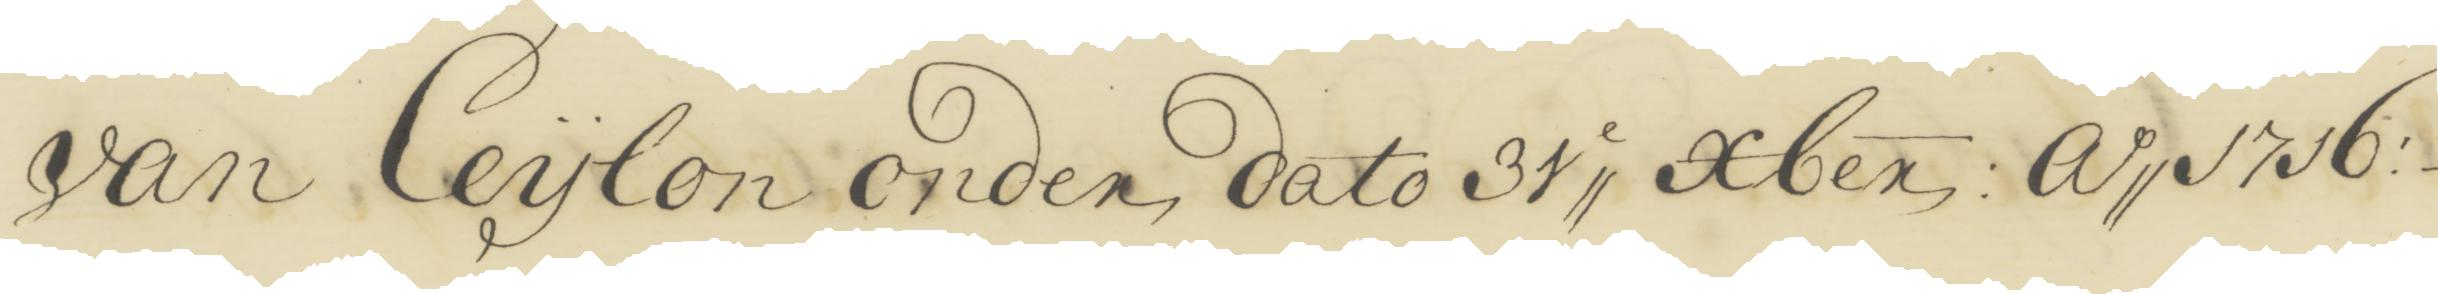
van Ceijlon onder dato 31„e xber: A„o 1716:
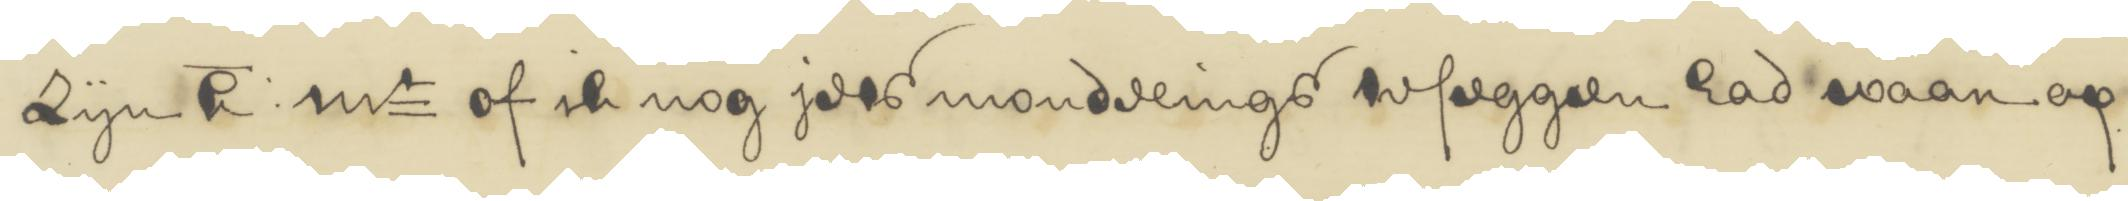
zijn k: m=t of ik nog jets mondelings te seggen had waar op
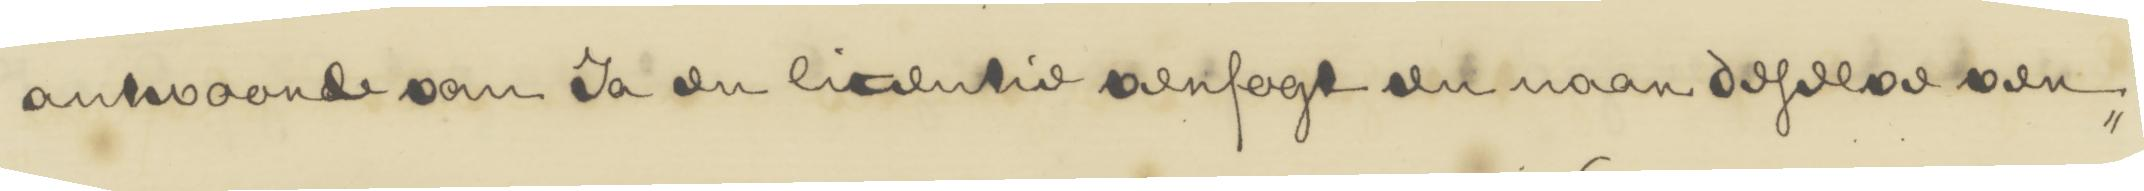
antwoorde van Ia en licentie versogt en naar deselve ver„
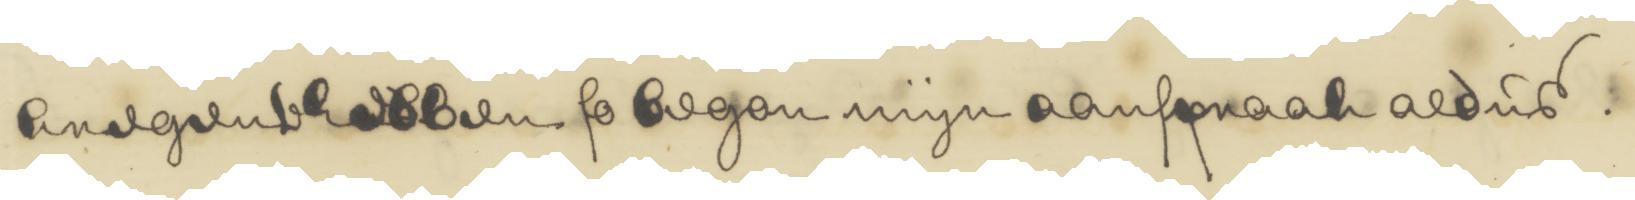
kregen te hebben so begon mijn aanspraak aldus.
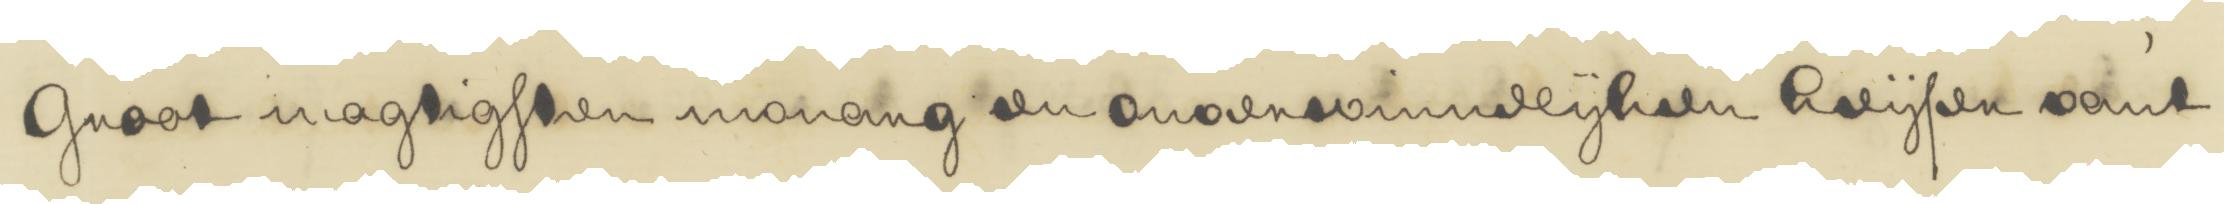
groot magtigsten monarg en onverwinnelijken keijser van’t
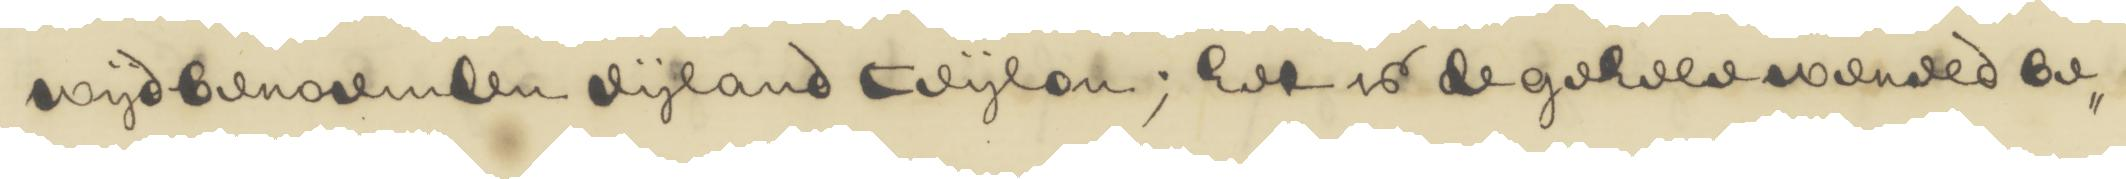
wijd benoemden eijland Ceijlon; het is de gehele wereld be„
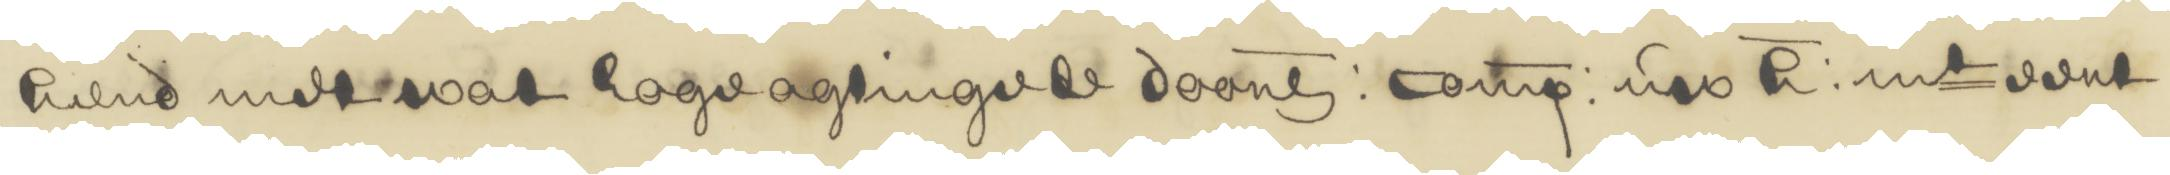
kend met wat hoge agtinge de doorl: comp: uw k: m=t eent
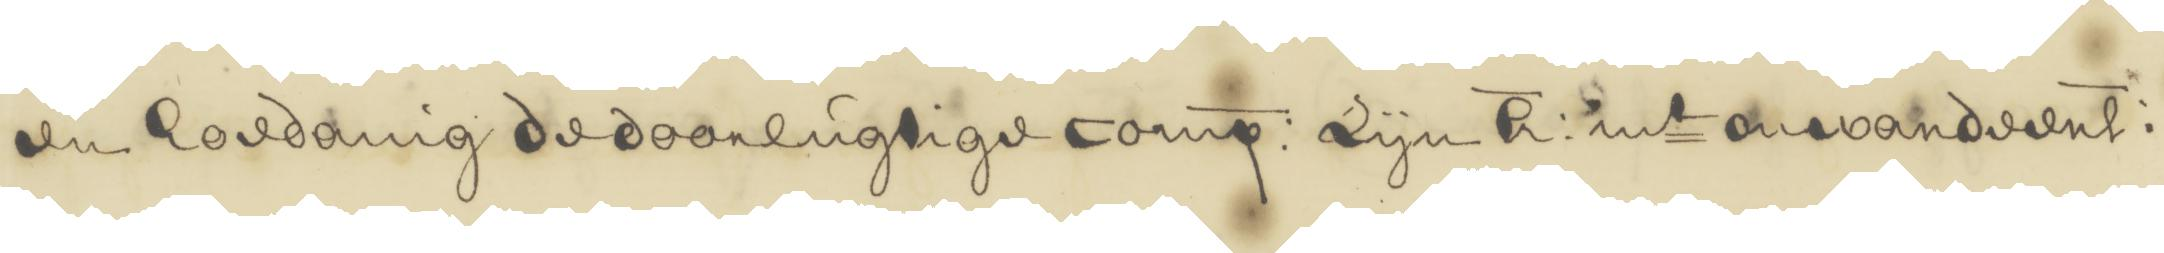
en hoedanig de doorlugtige comp: zijn k: m=t onwardeerl:
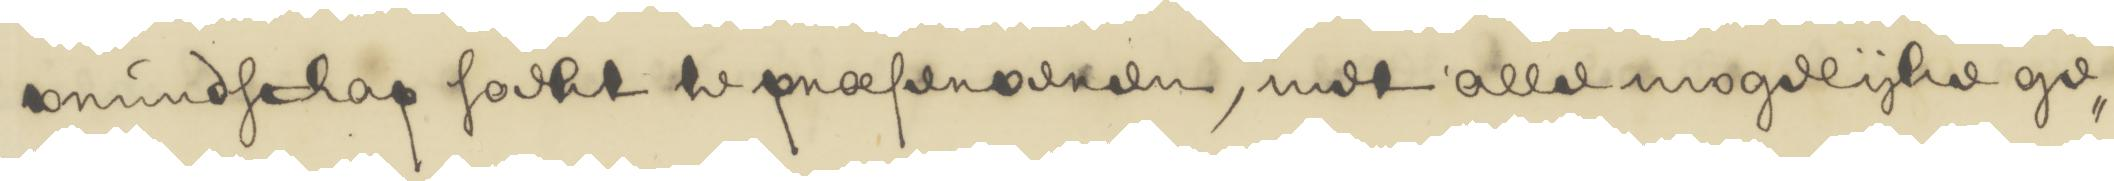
vrundschap soekt te praeserveren, met alle mogelijke ge„
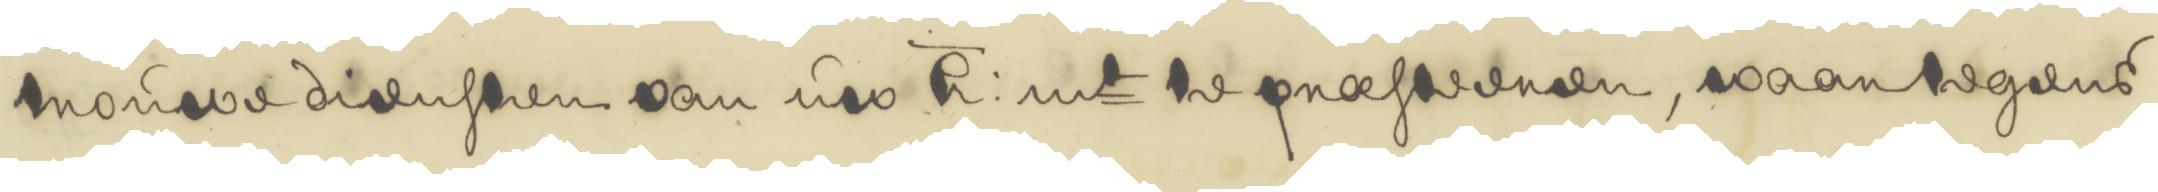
trouwe diensten van uw k: m=t te praesteeren, waar tegens
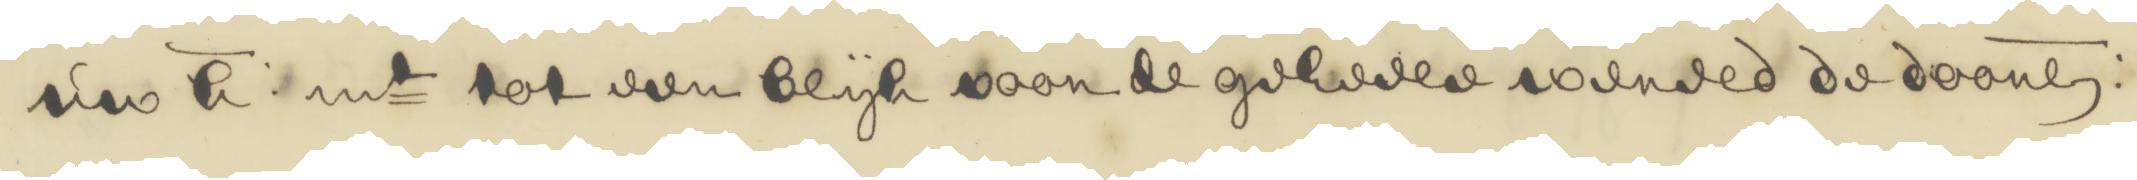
uw k: m=t tot een blijk voor de geheele wereld de doorl:
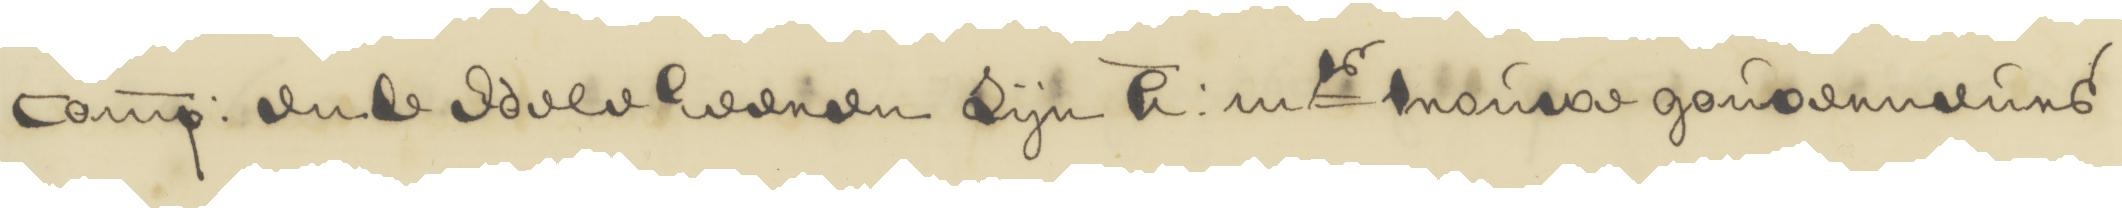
comp: en de Edele heeren zijn k: m=ts trouwe gouverneurs
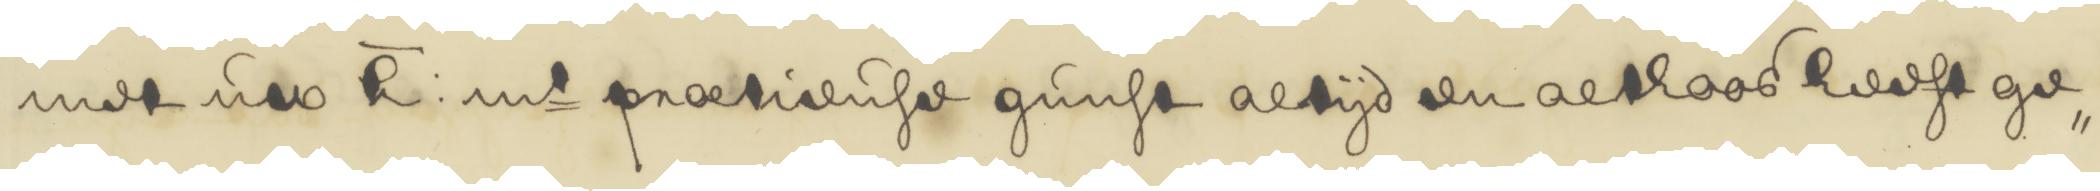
met uw k: m=t praetieuse gunst altijd en althoos heeft ge„
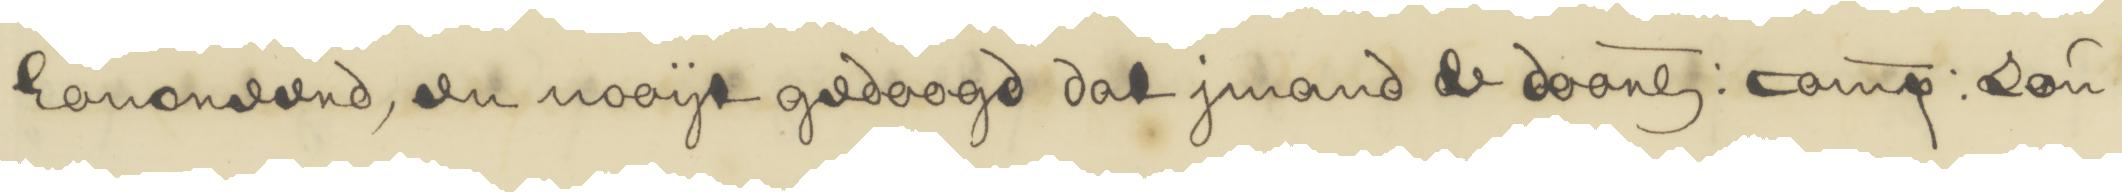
hononeerd, en nooijt gedoogd dat jmand de doorl: comp: zou
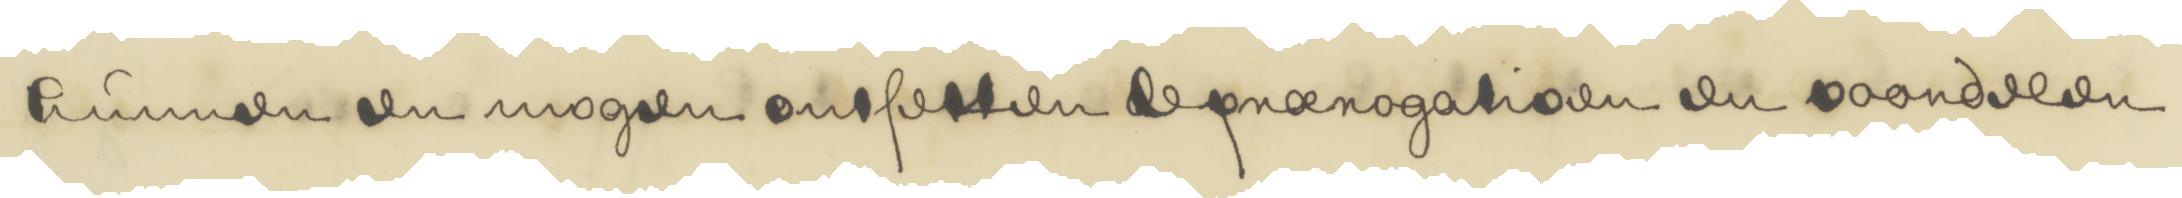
kunnen en mogen ontsetten de praerogativen en voordelen
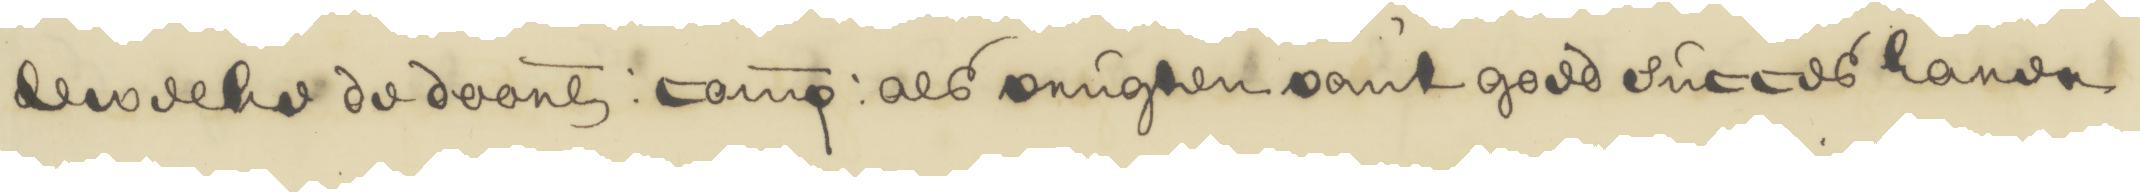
dewelke de doorl: comp: als vrugten van ’t goed succes haren
